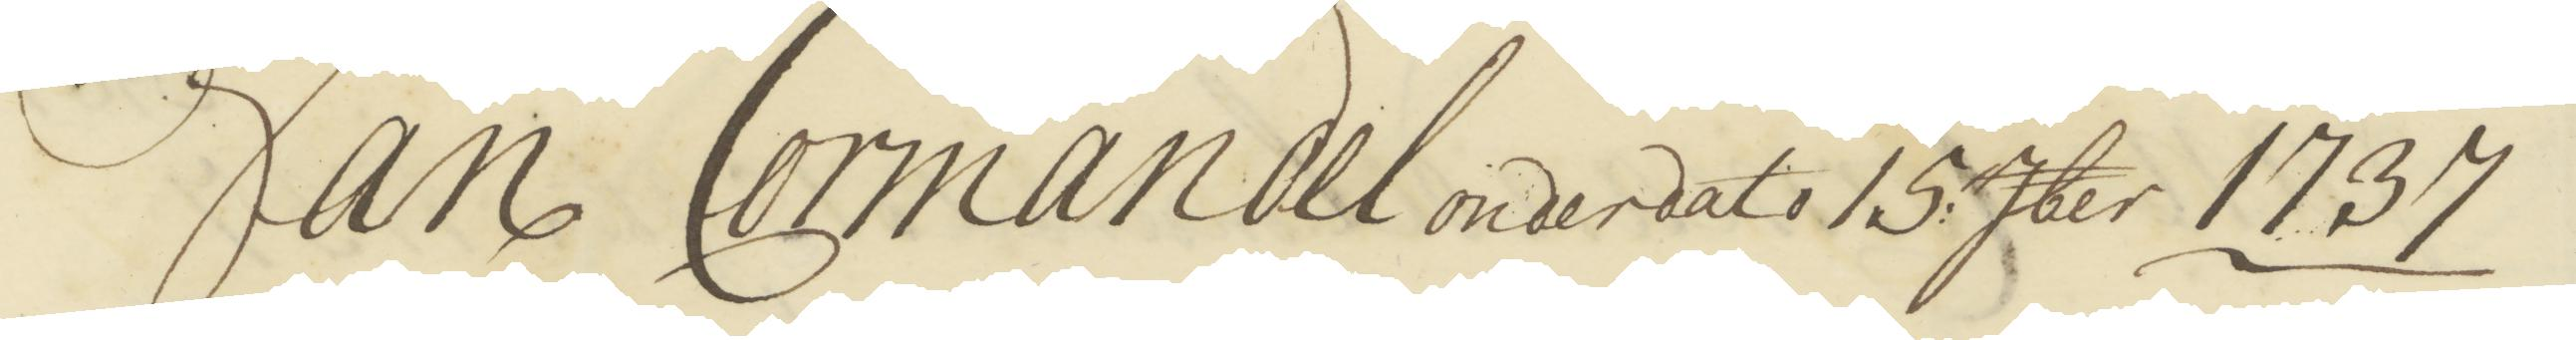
Van Cormandel onder dato 15: 7ber 1737
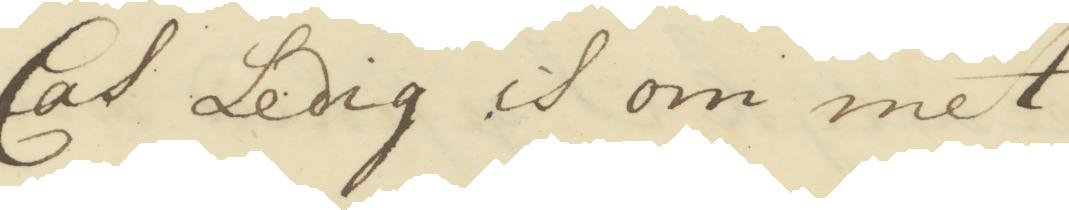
Cas Ledig is om met
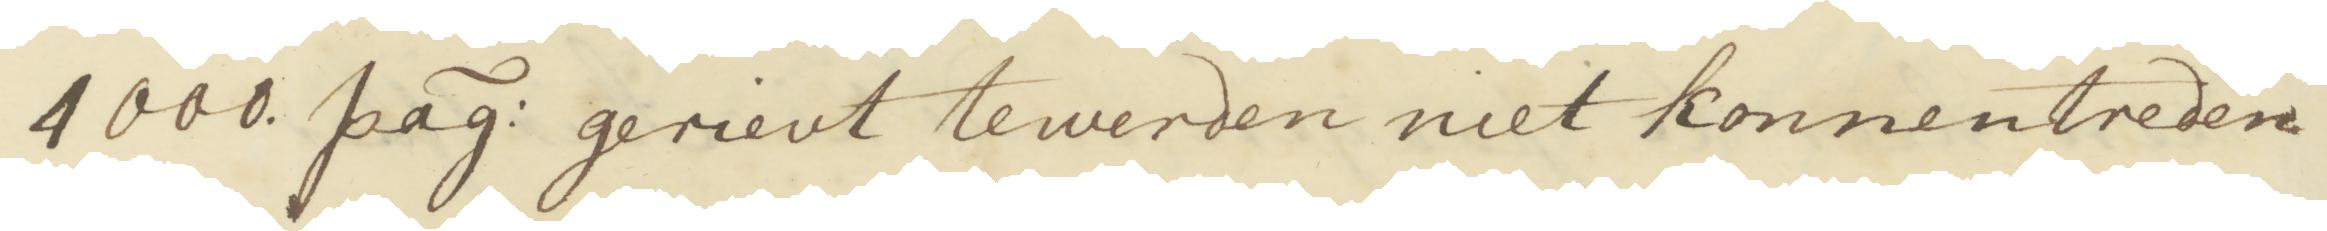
4000. pag: gerievt te werden niet konnen treden
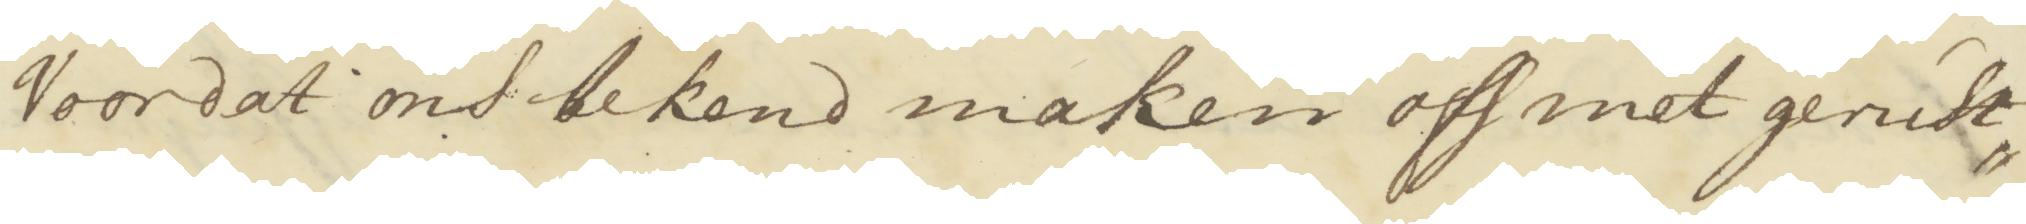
voordat ons bekend maken off met gerust„
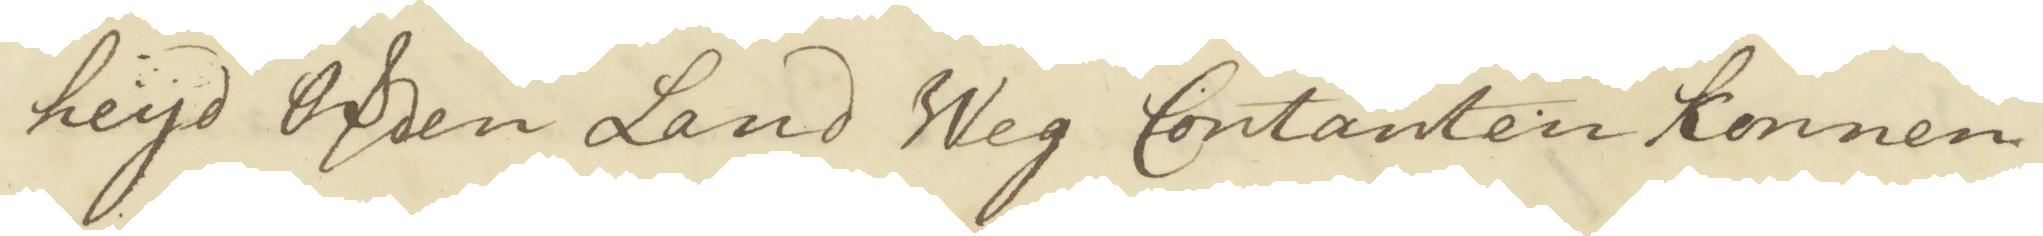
heijd over den Land weg Contanten konnen
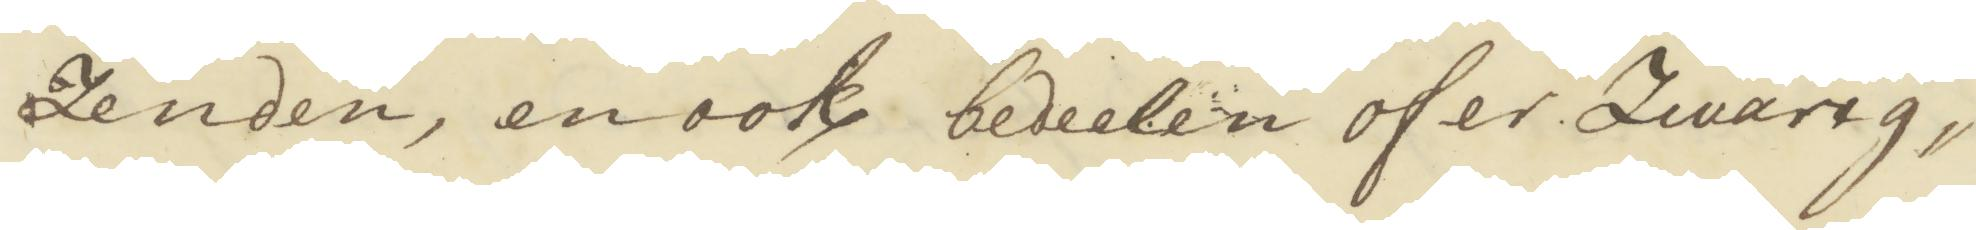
zenden, en ook bedeelen of er zwarig„
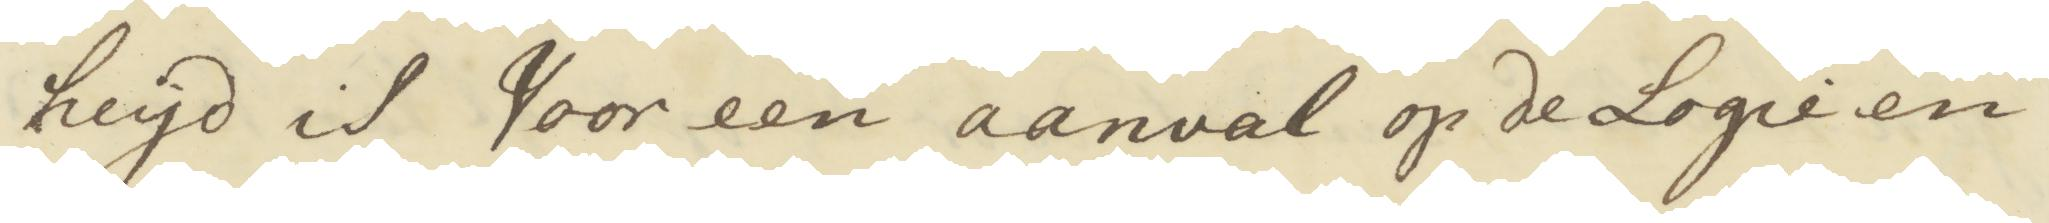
heijd is voor een aanval op de Logie en
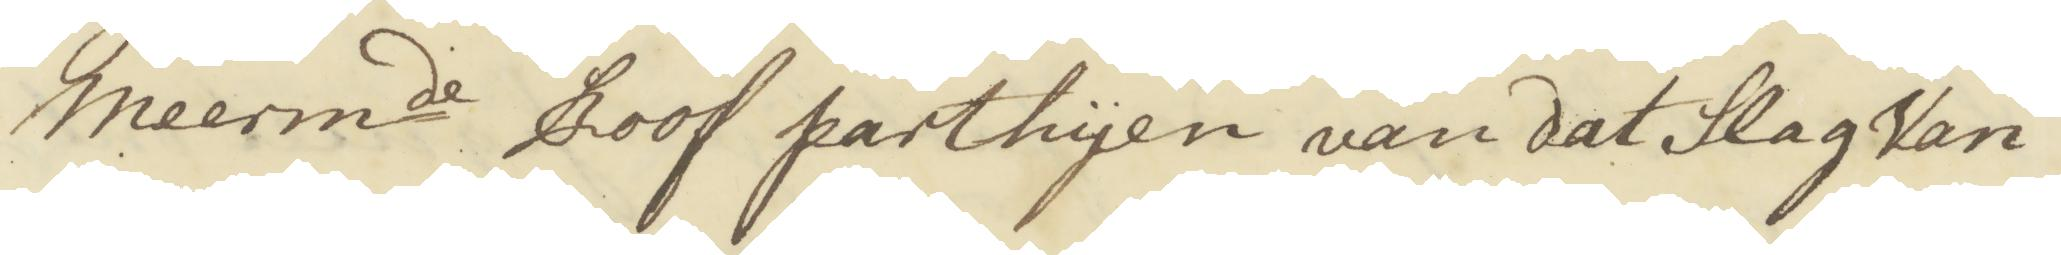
meerm=de hoof parthijen van dat slag van
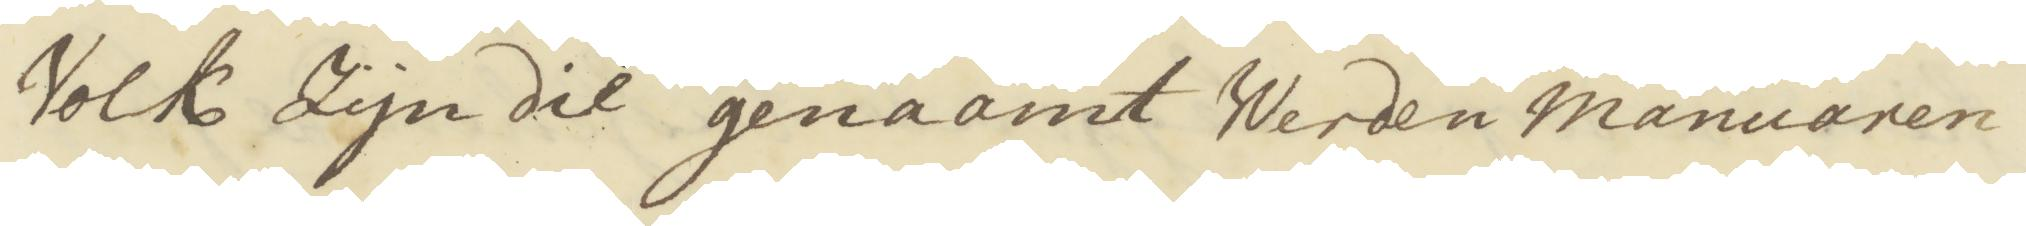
volk zijn die genaamt werden manuaren
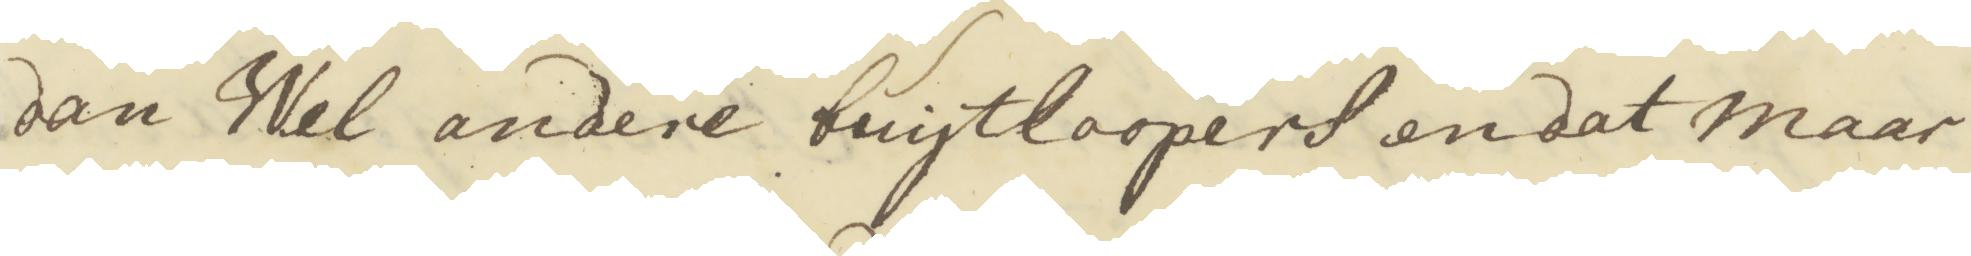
dan wel andere buijtloopers en dat maar
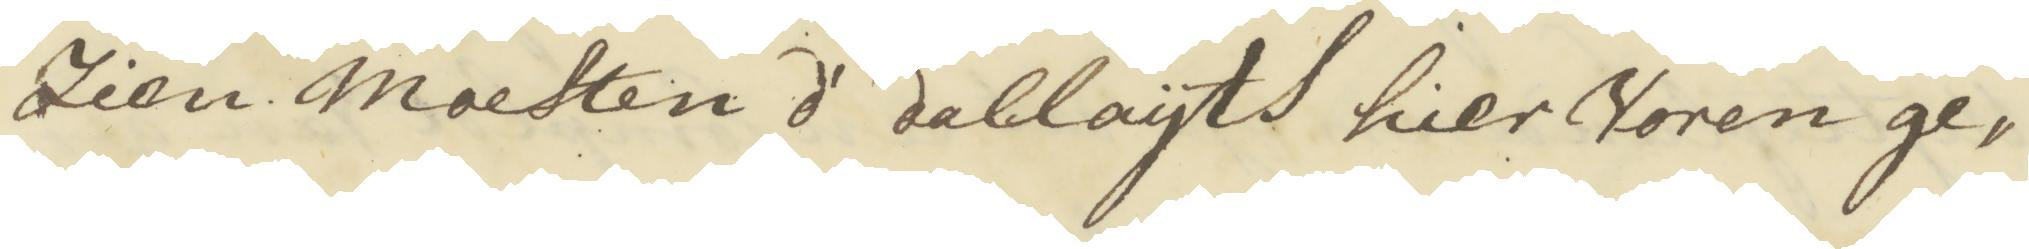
zien moesten d' dallaijts hier voren ge„
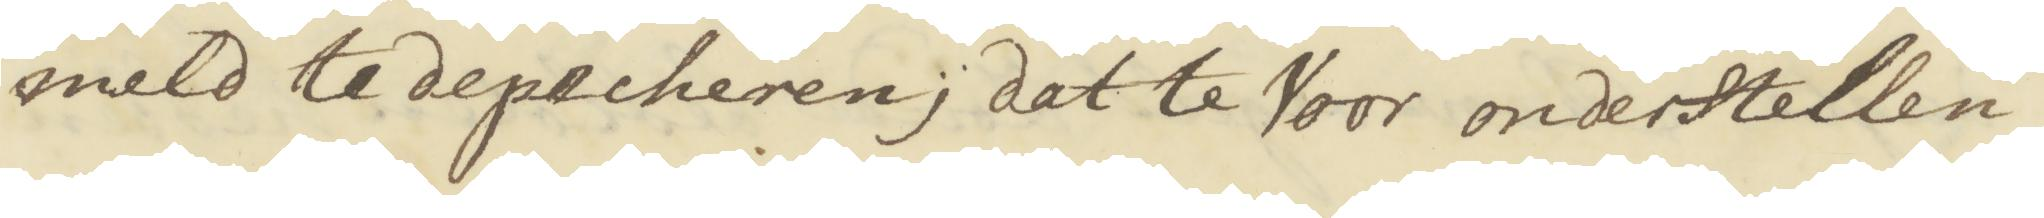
meld te depecheren; dat te voor onderstellen
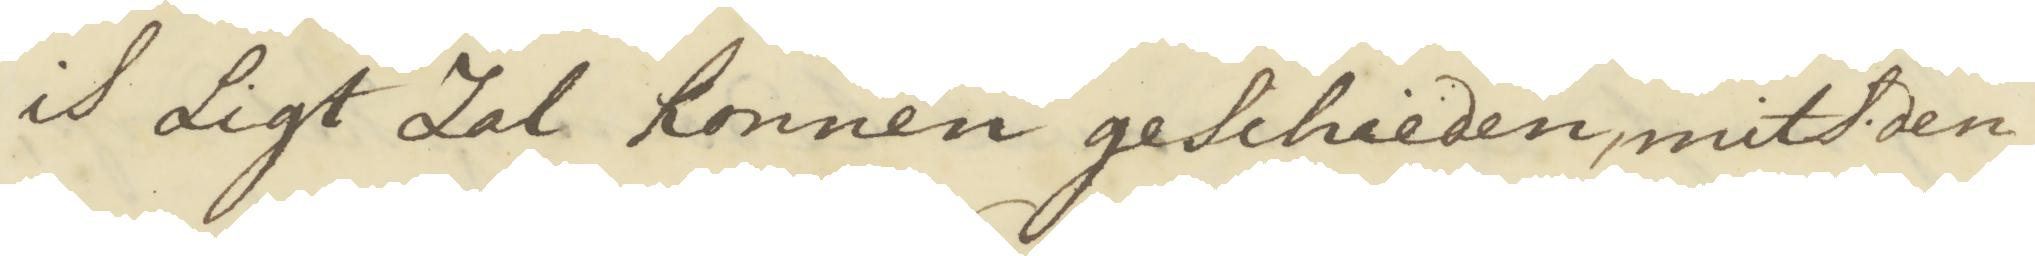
is Ligt zal konnen geschieden, mits den
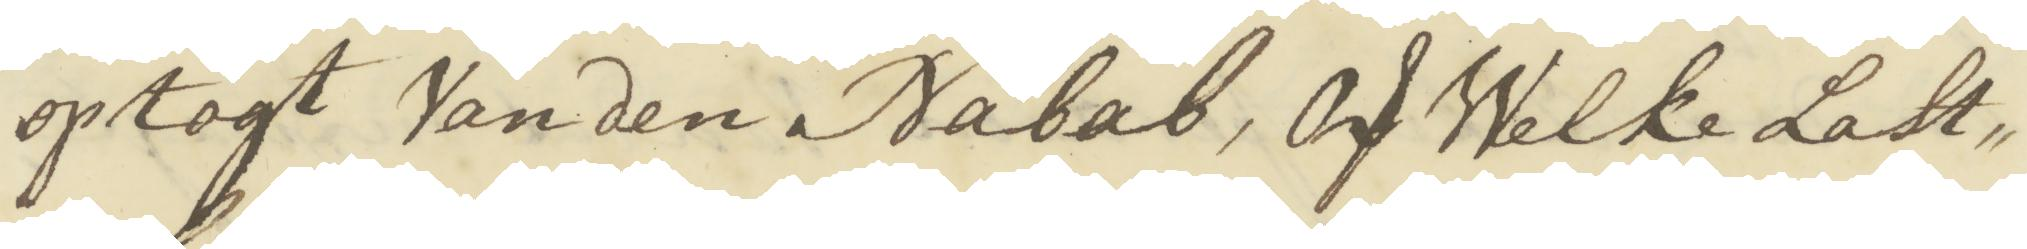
optogt van den Nabab, over welke Last„
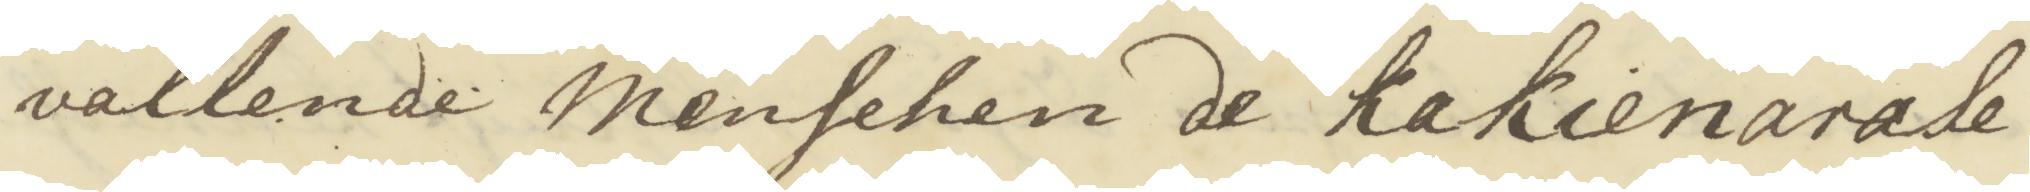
vallende menschen de kakienarase
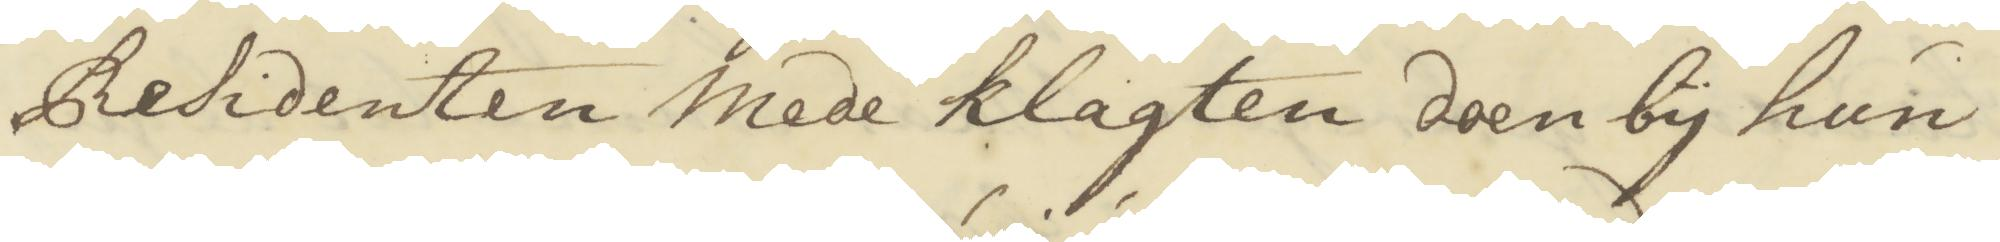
Residenten mede klagten doen bij hun
